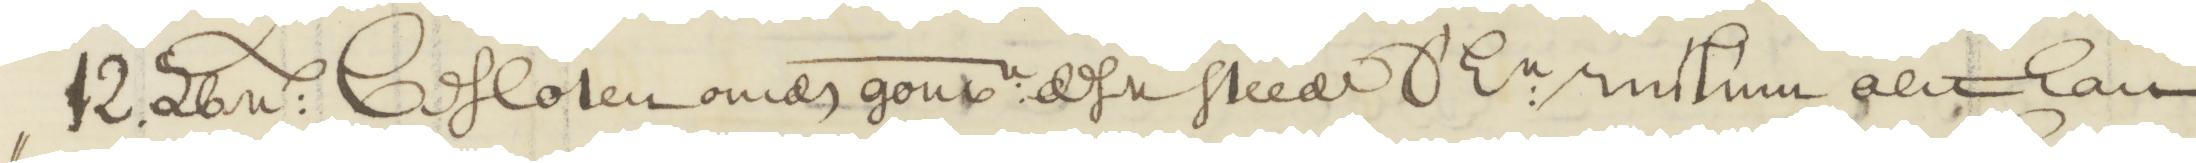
„ 12. 7ber: besloten omden gouv:r deser steede Dh:r rustum alechan
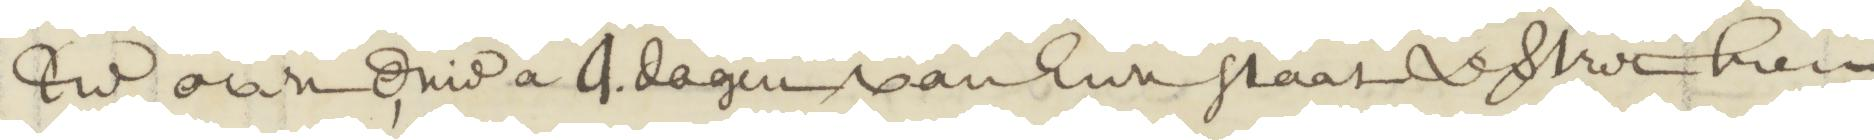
die over drie a 4. dagen van hier staat tevertrecken
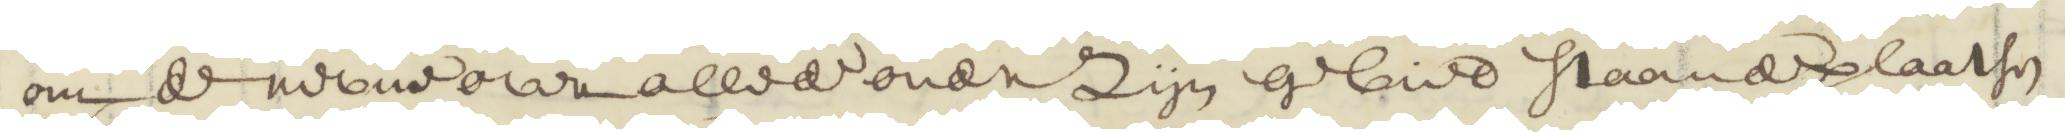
om de revue over allede onder zijn gebied staande plaatsen
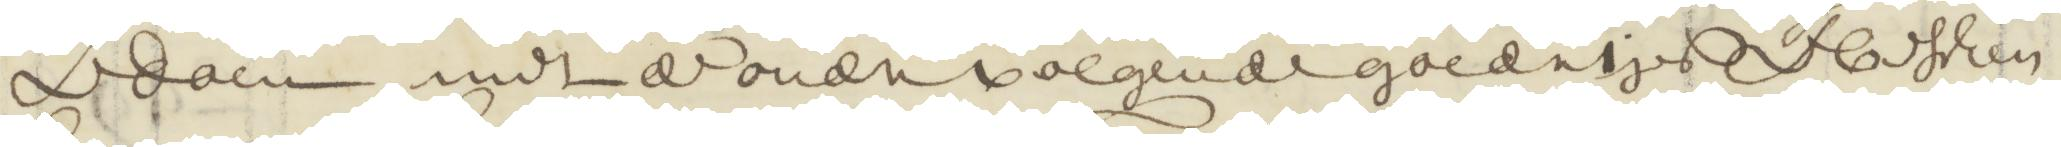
tedoen, met de onder volgende goedertjes te beschen
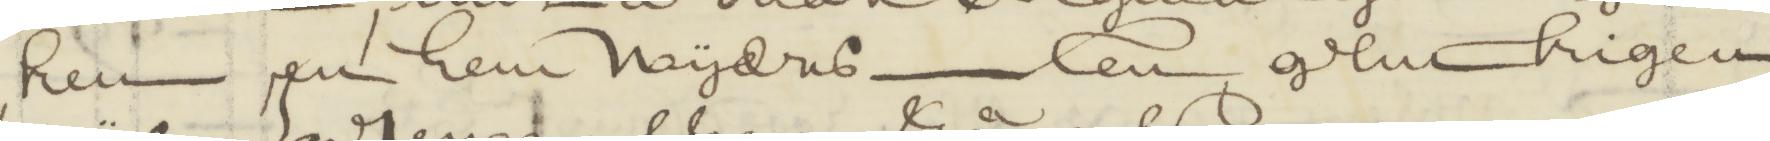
ken, en hem Wijders Een geluckigen
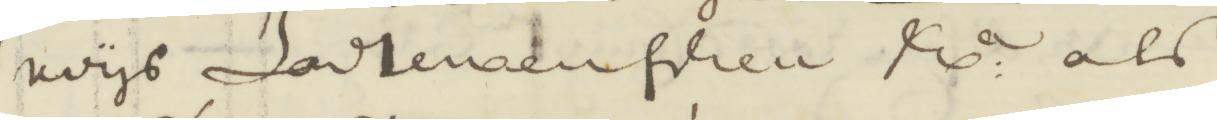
reijs toetewenschen &:a als
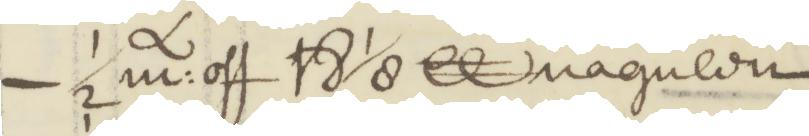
— ½ m: off 18 1/8 lb nagulen
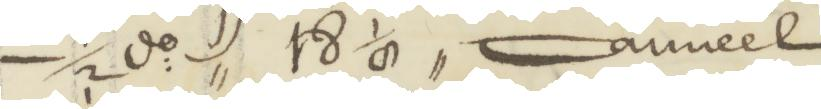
— ½ d:o „ 18 1/8 „ Canneel
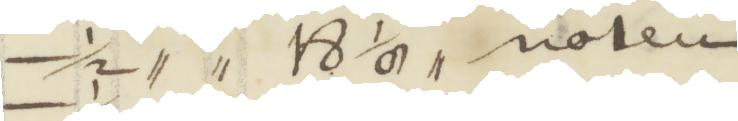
— ½ „ „ 18 1/8 „ noten
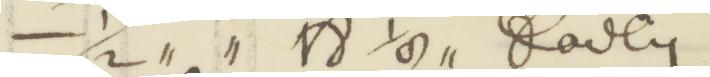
— ½ „ „ 18 1/8 „ foelij
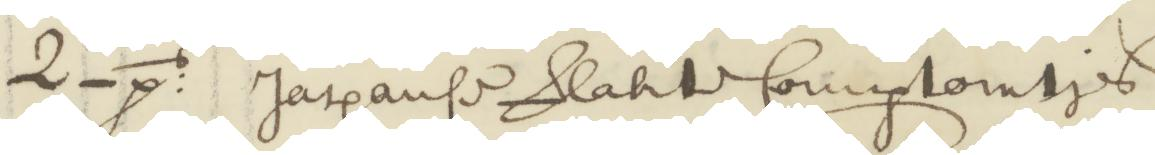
2 — p:s Japanse verlakte Comptoirtjes
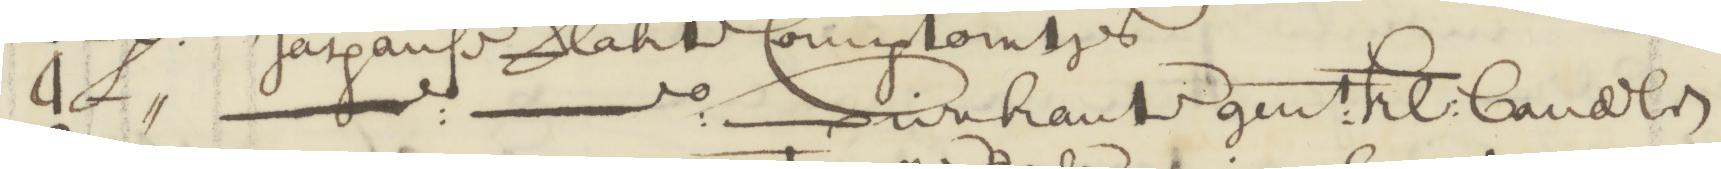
4 — „ D:o D:o vierkante gen:t kl: bandelen
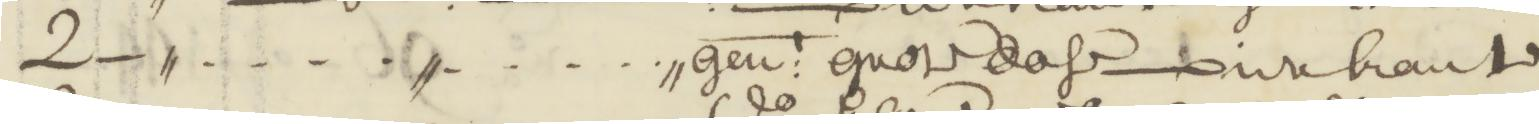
2 — „ - - - - „ - - - - - „ gen:t grote dose vierkante
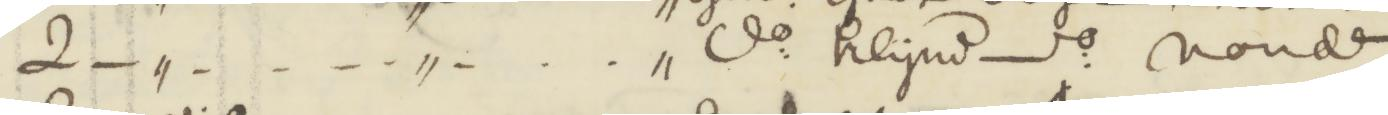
2 — „ - - - - „ - - - „ d:o klijne d:o ronde
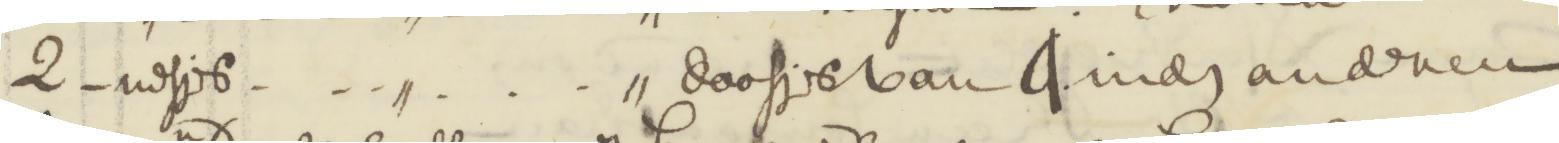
2 — nesjes - - - „ - - - „ doosjes van 4. inden anderen
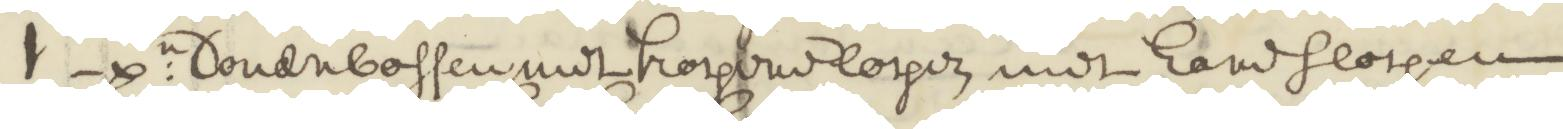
1 — p:r Donderbossen met kopere lopen met hare slopen
